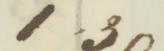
1. 30
